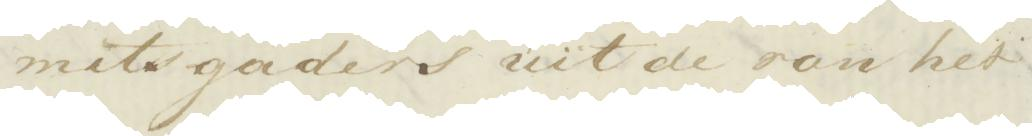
mitsgaders uit de van het
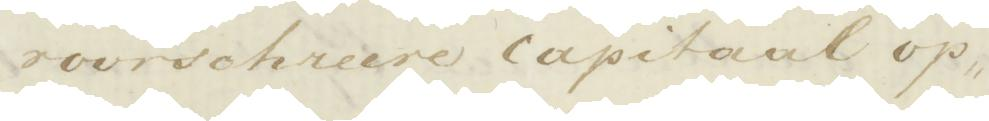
voorschreeve capitaal op„
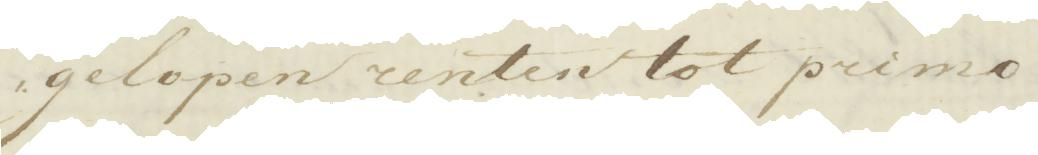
„gelopen renten tot primo
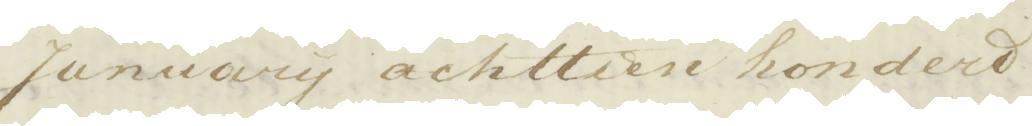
Januarij achttien honderd
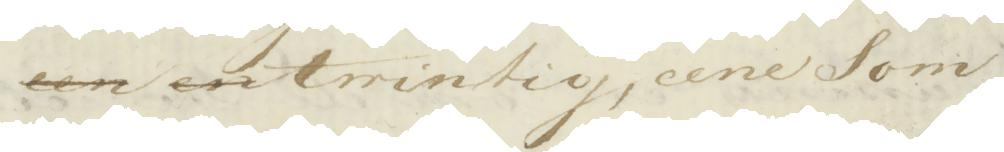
een en twintig, eene Som
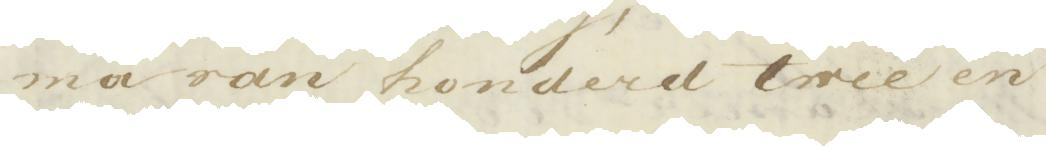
ma van honderd twee en
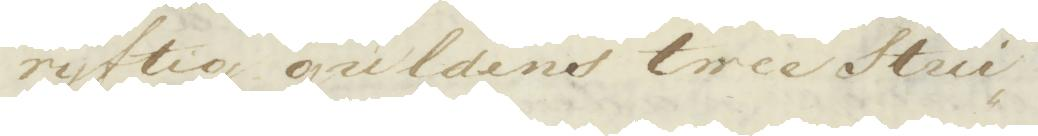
vyftig guldens twee stui„
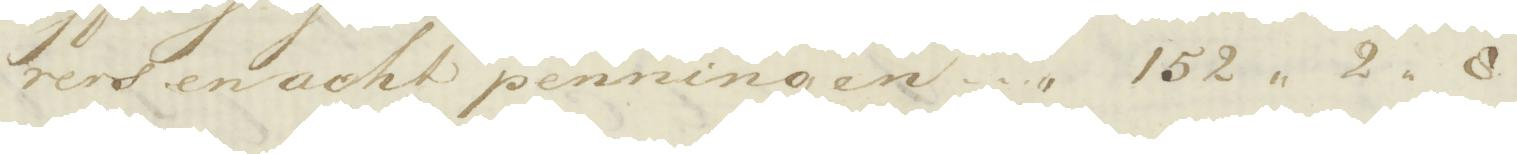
vers en acht penningen - - - „ 152 „ 2 „ 8
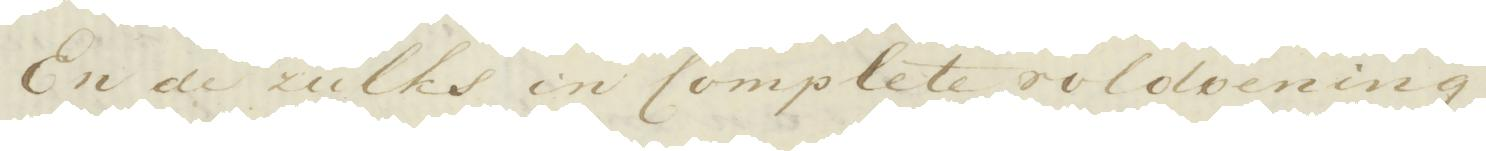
En de zulks in Complete voldoening
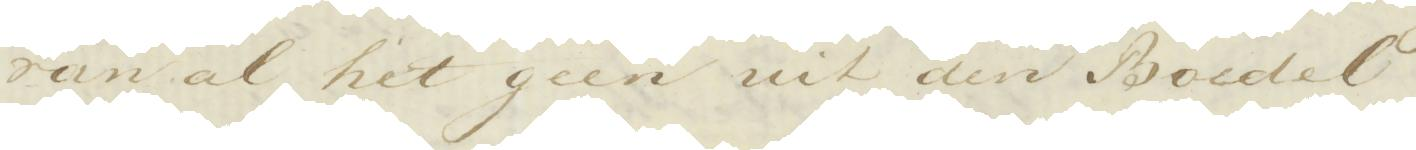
van al het geen uit den Boedel
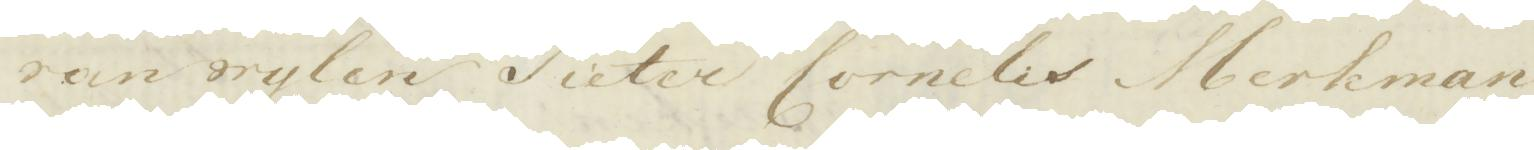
van wylen Pieter Cornelis Merkman
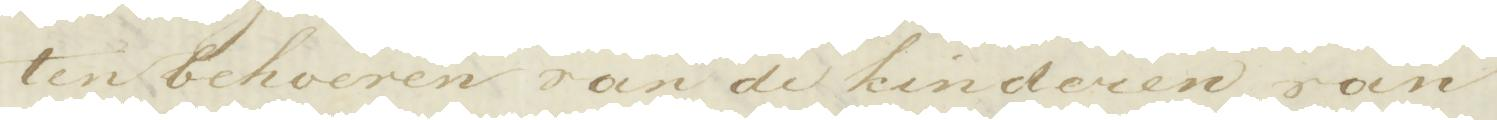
ten behoeven van de kinderen van
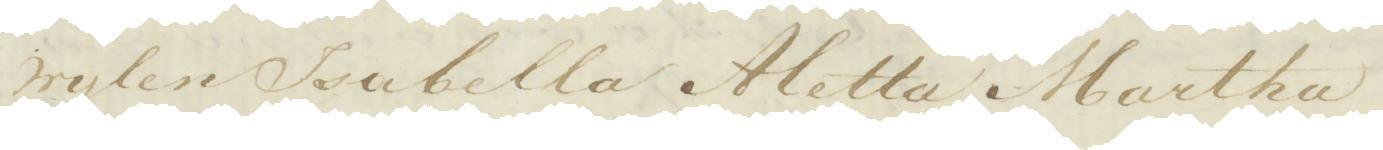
wylen Isabella Aletta Martha
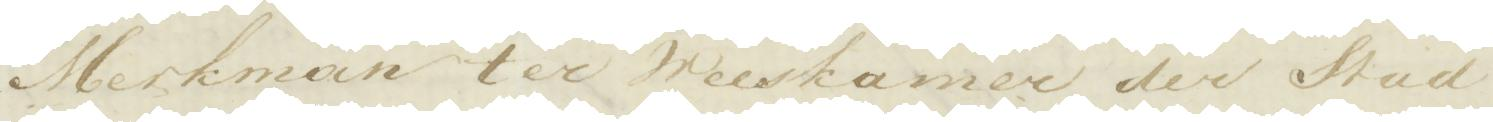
Merkman ter Weeskamer der Stad
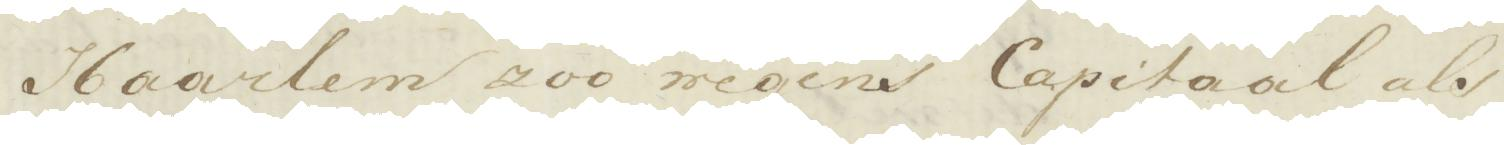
Haarlem zoo wegens Capitaal als
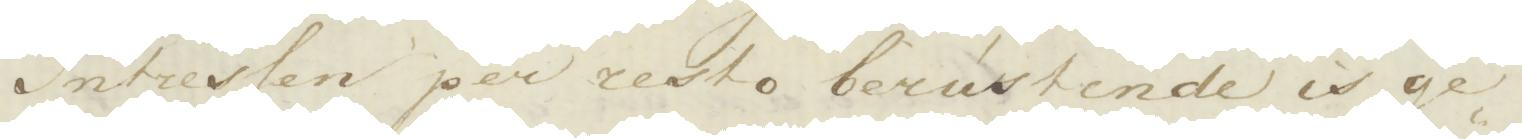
Intressen per resto berustende is ge„
